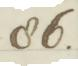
86.
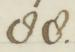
88.
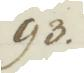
93.
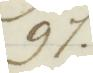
97.
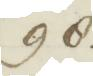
98.
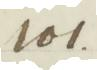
101.
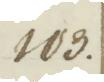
103.
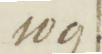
109.
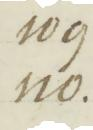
110.
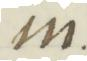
111.
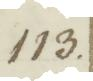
113.
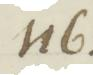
116.
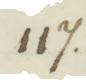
117.
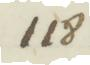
118.
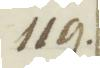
119.
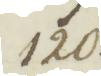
120.
